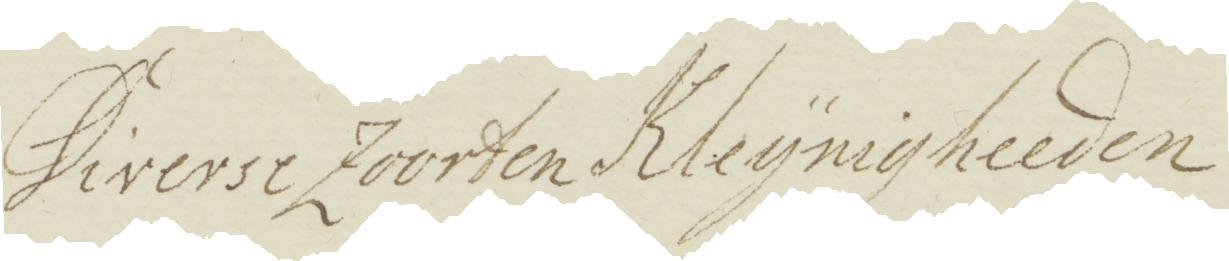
Diverse Zoorten Kleijnigheeden
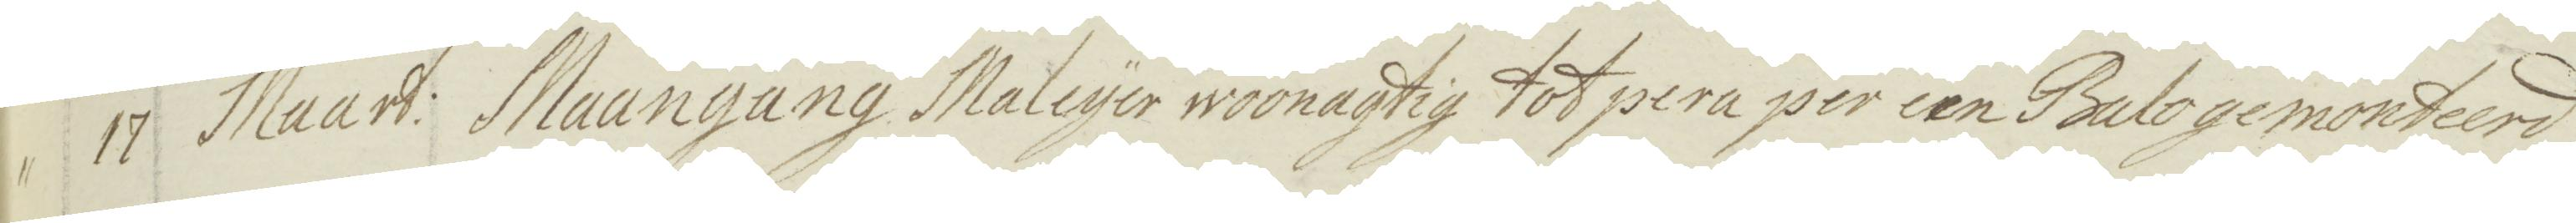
„ 17 Maart: Maangang Maleijer woonagtig tot pera per een Bato gemonteerd
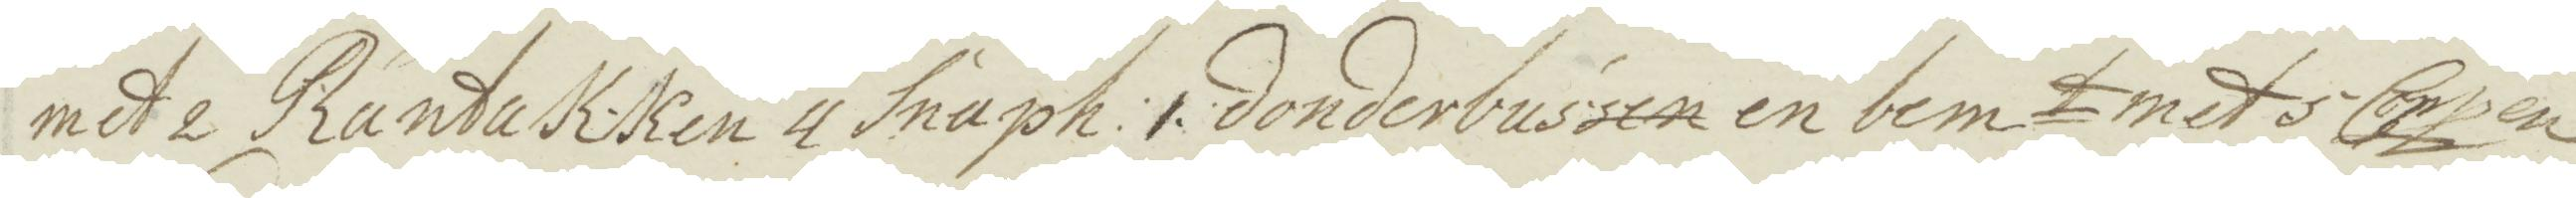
met 2 Rantakken 4 Snaph: 1: donderbussen en bem=t met 5 Coppen
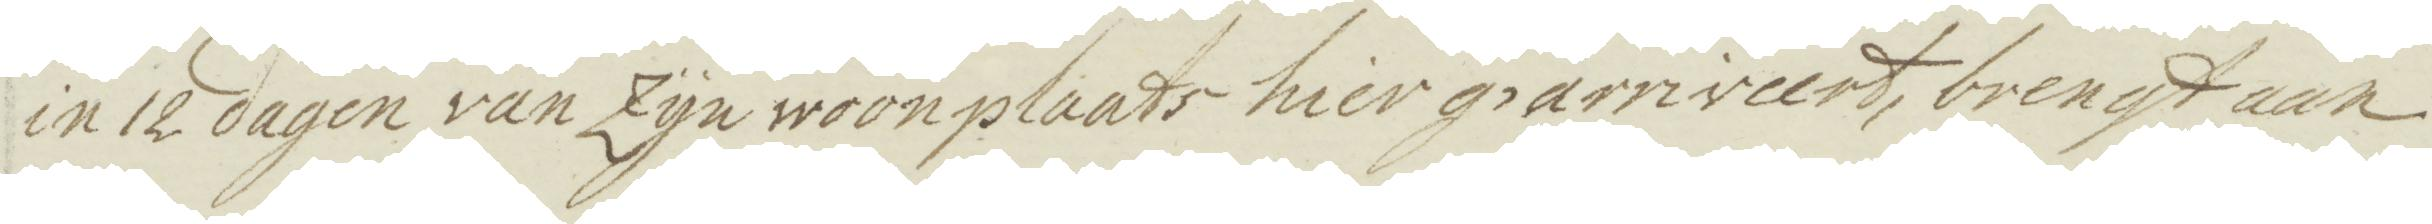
in 12 dagen van Zijn woonplaats hier g'arriveert, brengt aan
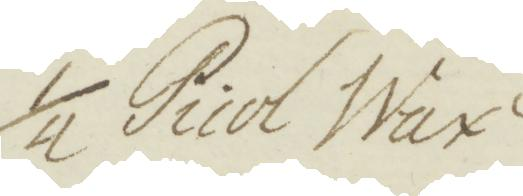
¼ Picol Wax
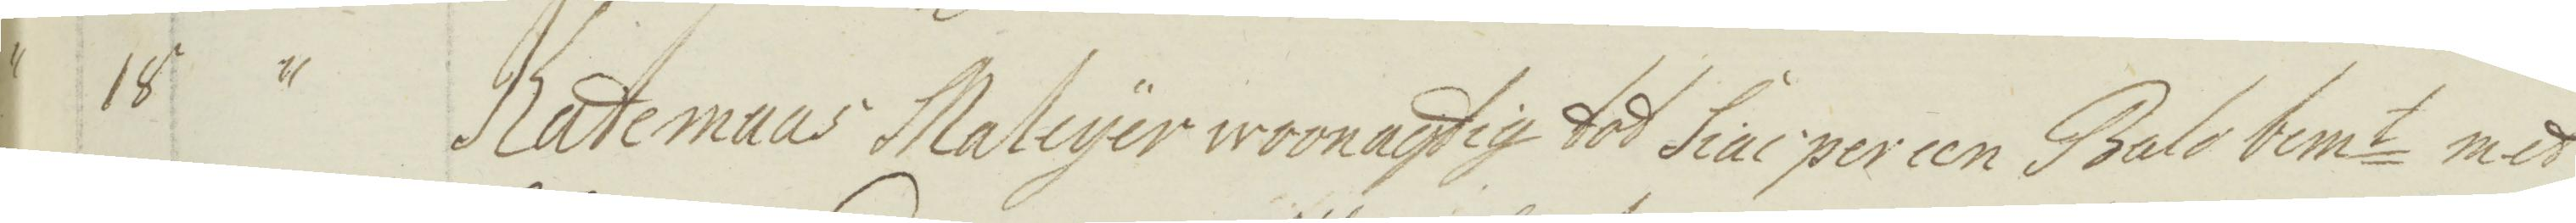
„ 18 „ Katemaas Maleijer woonagtig tot Siac per een Bato bem=t met
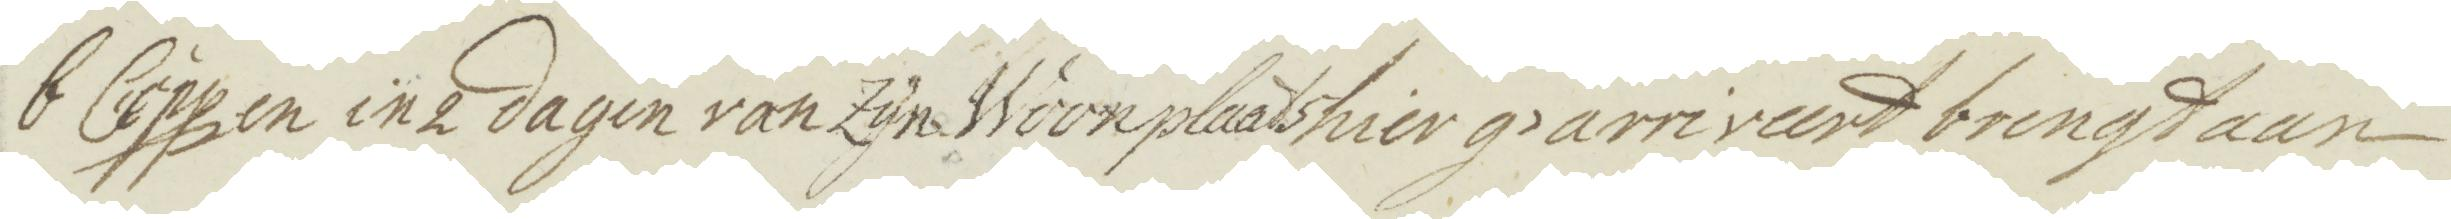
6 Coppen in 2 dagen van zijn Woonplaats hier g’arriveert brengt aan
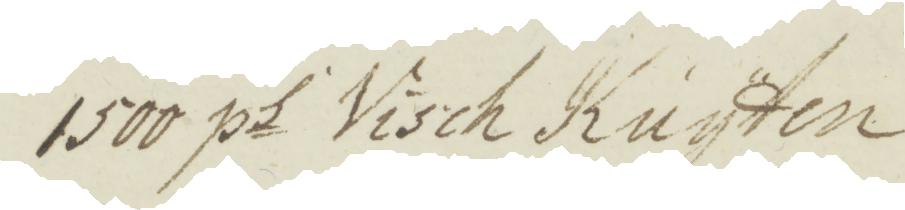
1500 p=s Visch Kuijten
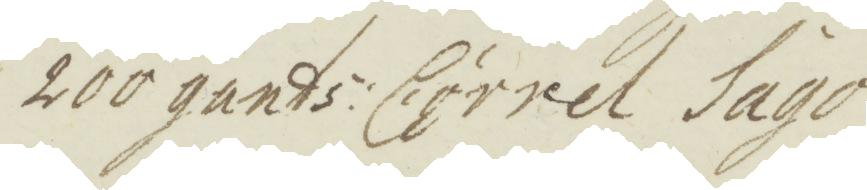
200 gants: Correl sago
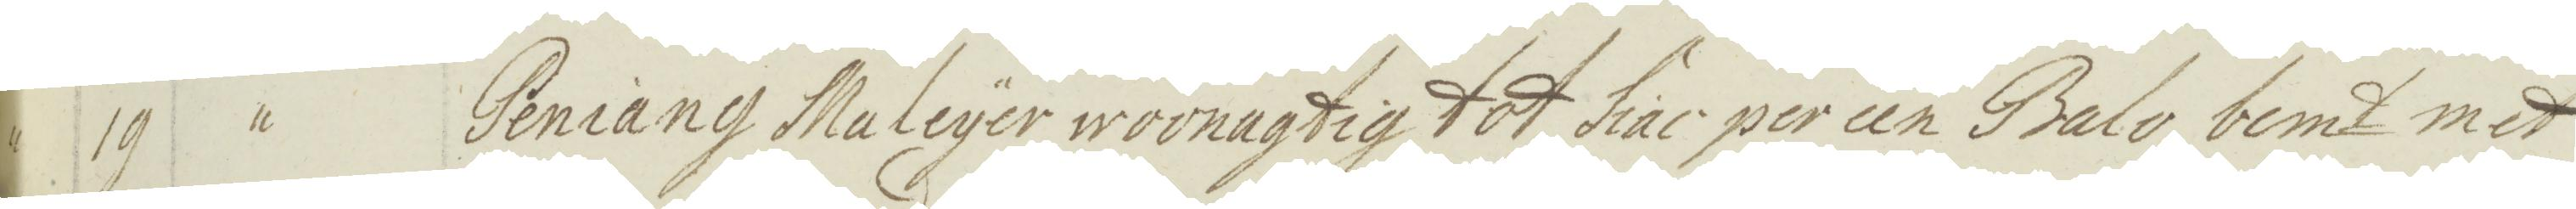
„ 19 „ Peniang Maleijer woonagtig tot Siac per een Balo bem=t met
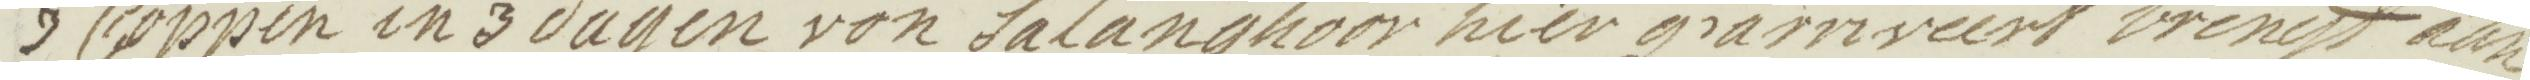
3 Coppen in 3 dagen van Salanghoor hier g'arriveert brengt aan
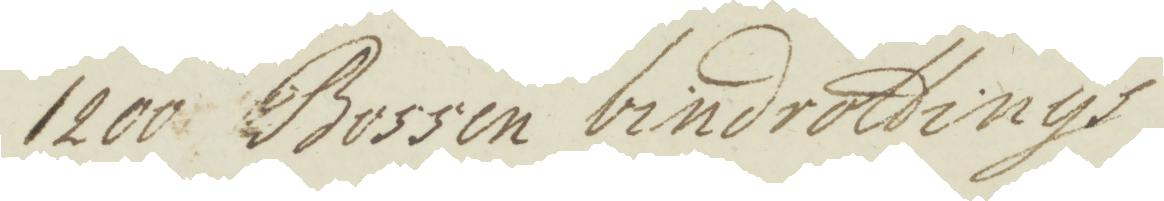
1200 Bossen bindrottings
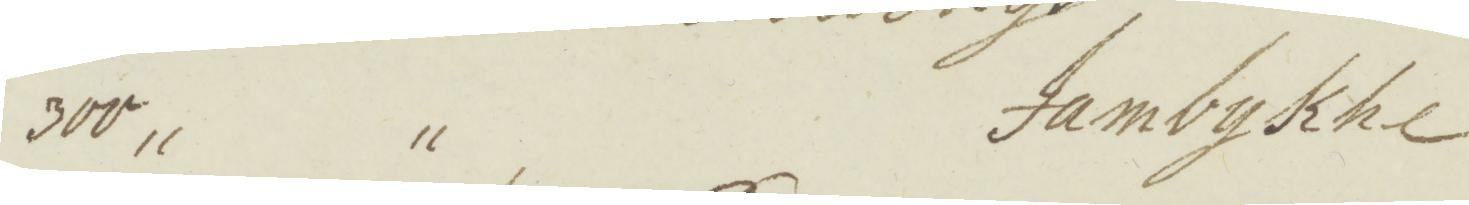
300 „ „ tambykhe
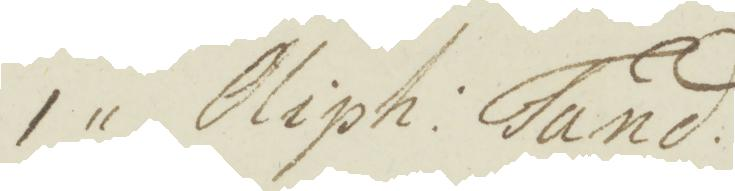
1 „ Oliph: Tand.
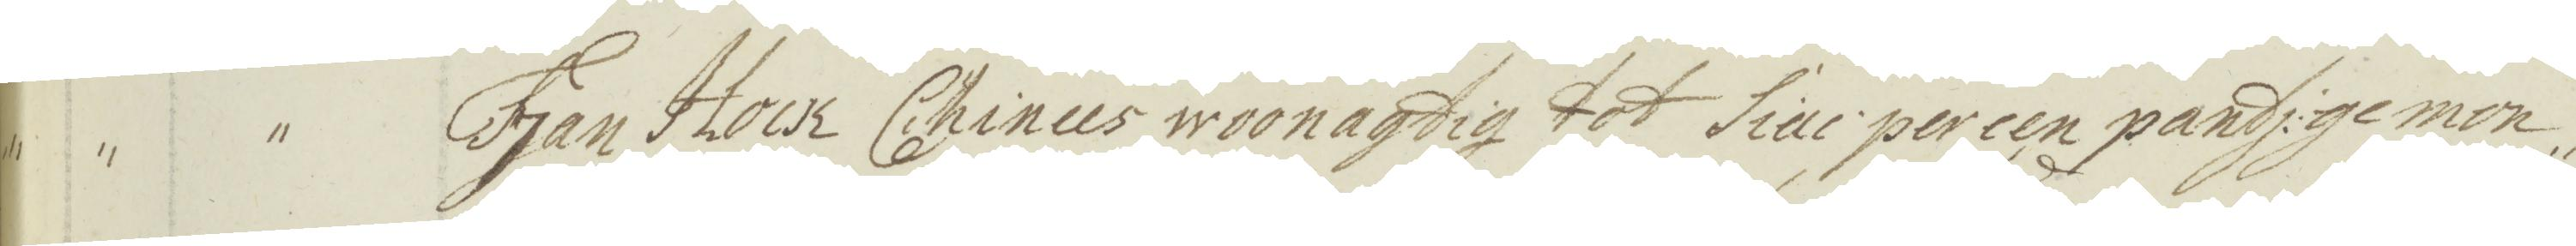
„ „ „ Tjan Hoik Chinees woonagtig tot Siac per een pantj: gemon„
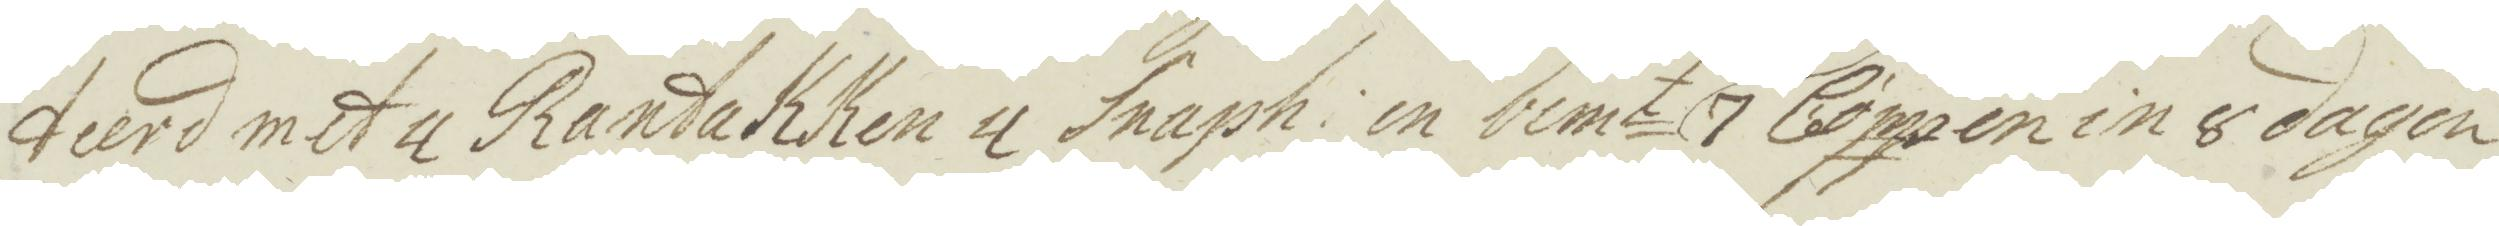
teerd met 4 Rantakken 4 snaph: en bem=t met 7 Coppen in 8 dagen
